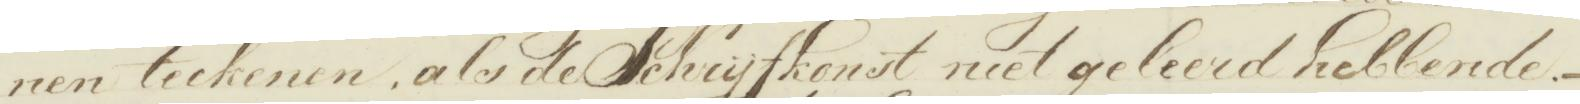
nen teekenen, als de Schrijfkonst niet geleerd hebbende.
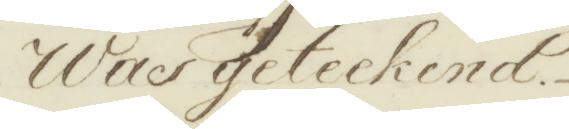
Was geteekend.
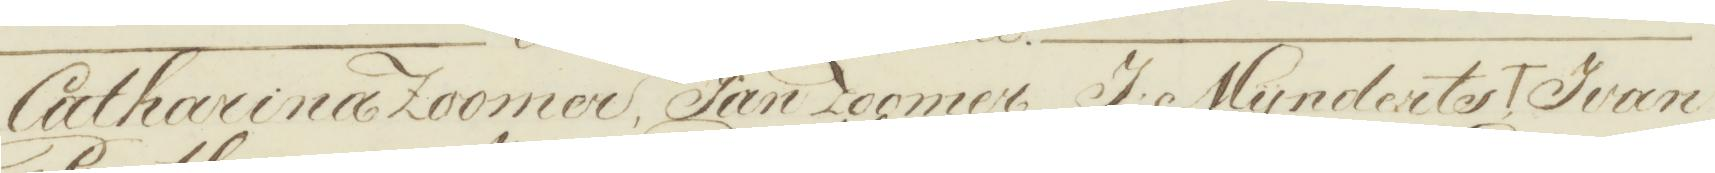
Catharina Zoomer, Ian Zoomer, I. Mijnderts,¶ I van
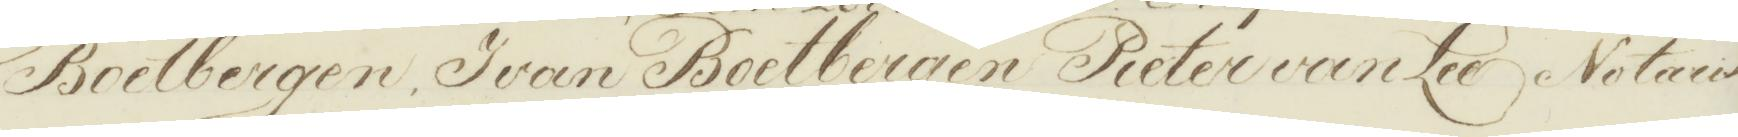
Boetbergen, I van Boetbergen Pieter van Lee Notaris
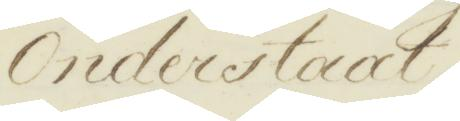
Onderstaat.
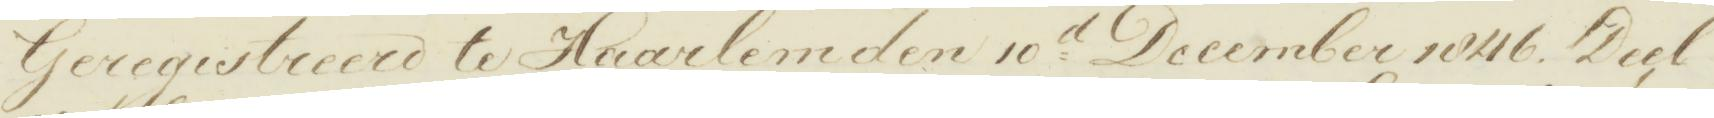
Geregistreerd te Haarlem den 10=d December 1846. Deel
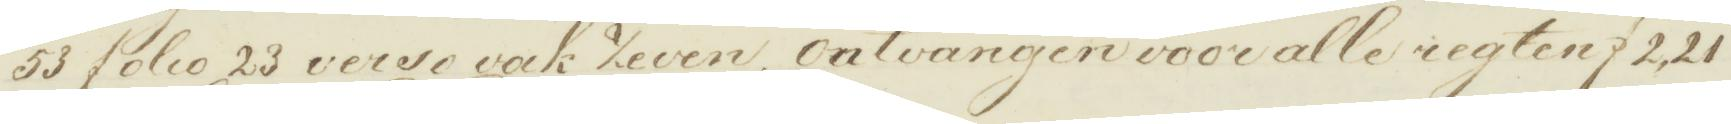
53 folio 23 verso vak zeven, ontvangen voor alle regten ƒ2,21
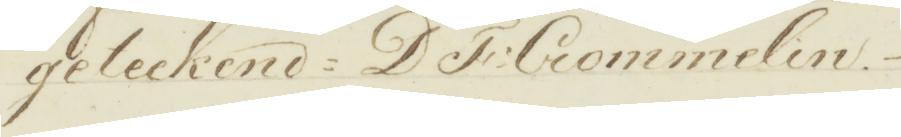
geteekend = D F: Crommelin.
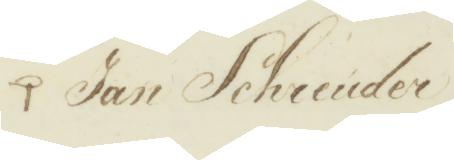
¶ Ian Schreuder
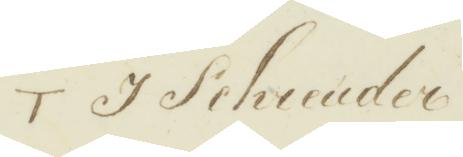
¶ I Schreuder
